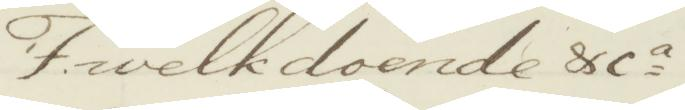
'T. welk doende &c=a
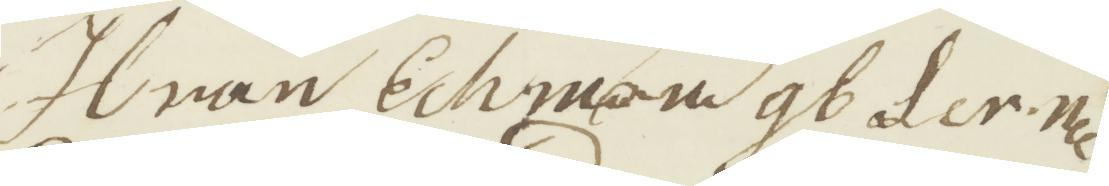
H van Echmond gb Sernee
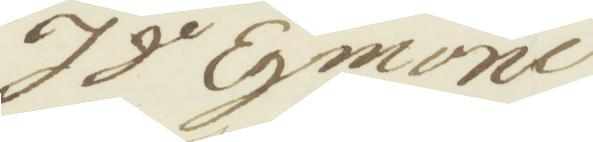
JV Egmond
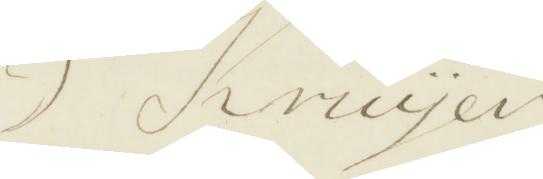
P Kruijer
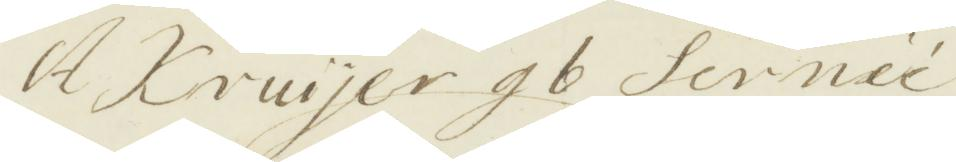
A Kruijer gb Sernéé
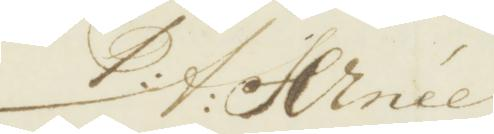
P: A: Sernée
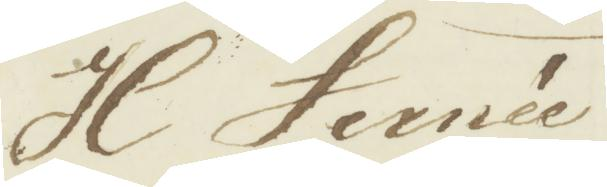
H Sernée
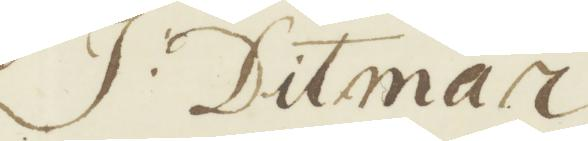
J: Ditmar
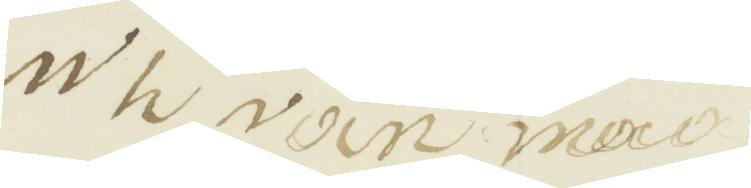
wh van maas
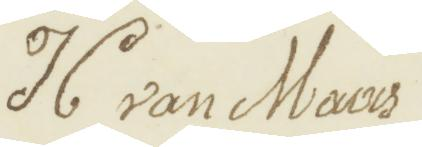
H van Maas
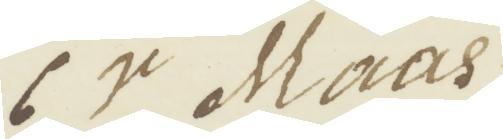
C V Maas
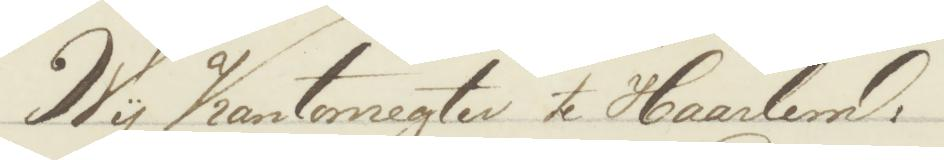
Wij Kantonregter te Haarlem,
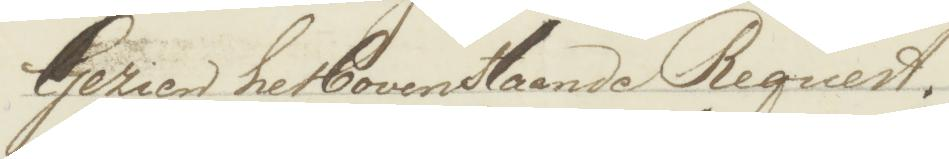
Gezien het bovenstaande Request,
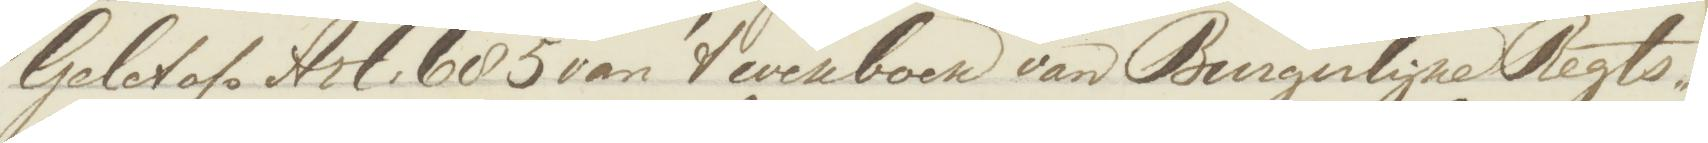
Gelet op Art,685 van ’t wetboek van Burgerlijke Regts„
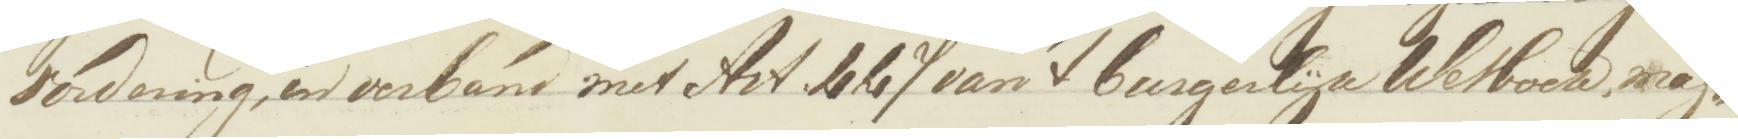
vordering, in verband met Art 447 van ’t burgerlijk Wetboek, wag„
